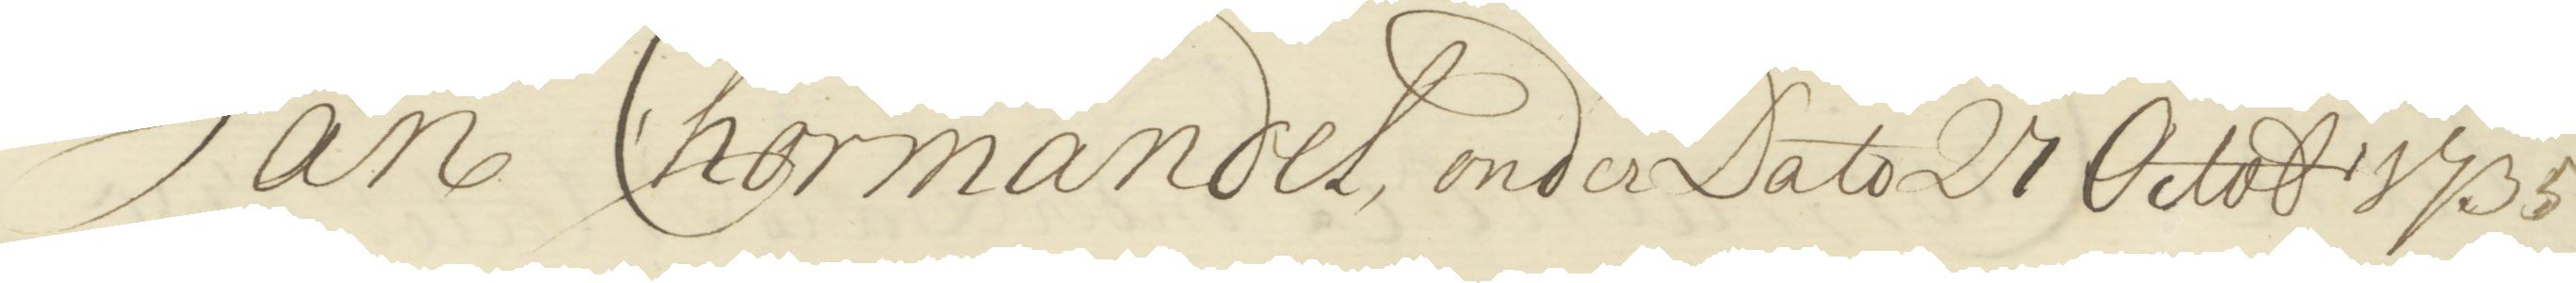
Van Chormandel, onder Dato 27 Octob:' 1735
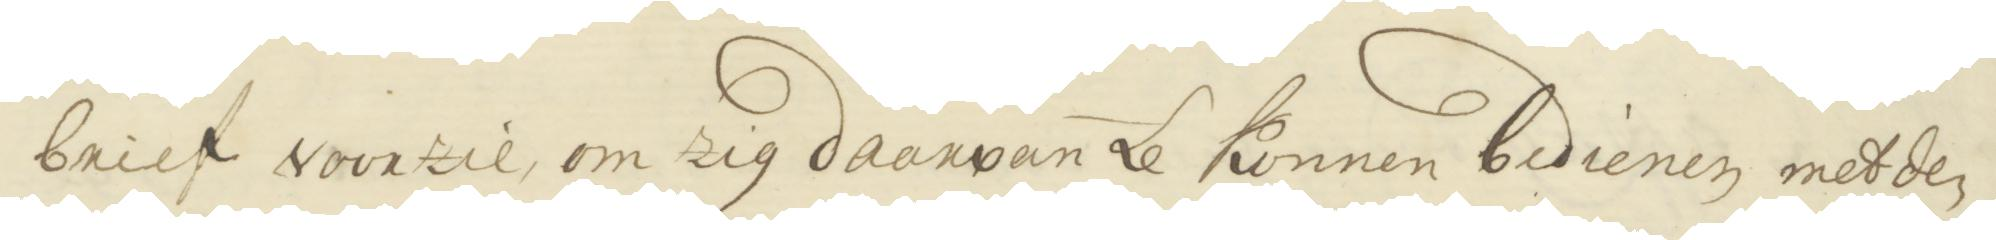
brief voorzie, om zig daarvan te konnen bedienen met den
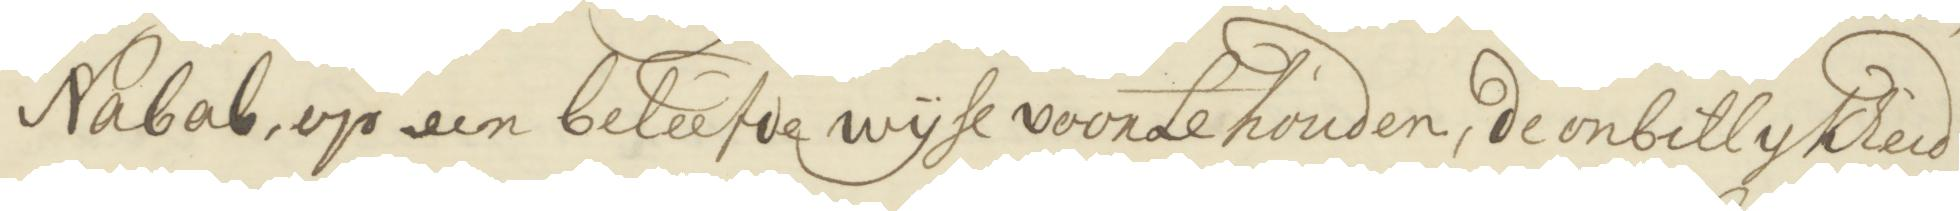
Nabab, op een beleefde wijse voor te houden, de onbillykheid
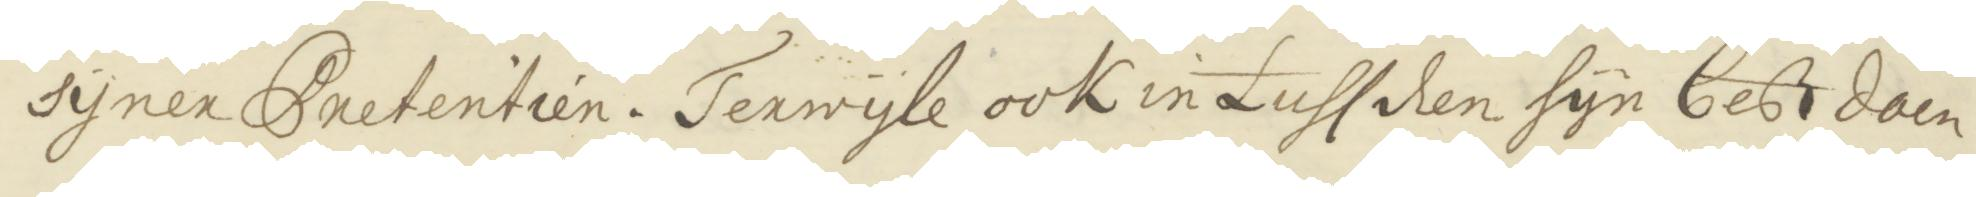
sijner Pretentien. Terwijle ook in tusschen sijn best doen
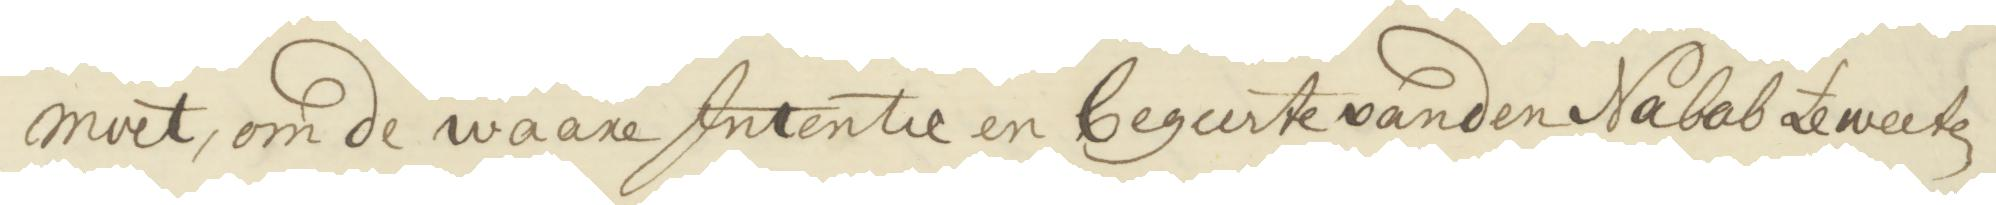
moet, om de waare Jntentie en begeerte van den Nabab te weeten
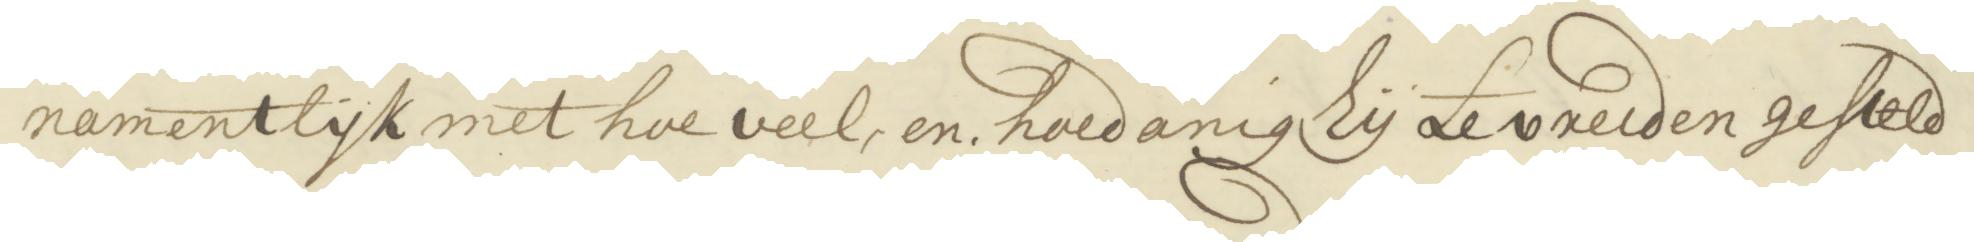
namentlijk met hoe veel, en hoedanig hij te vreeden gesteld
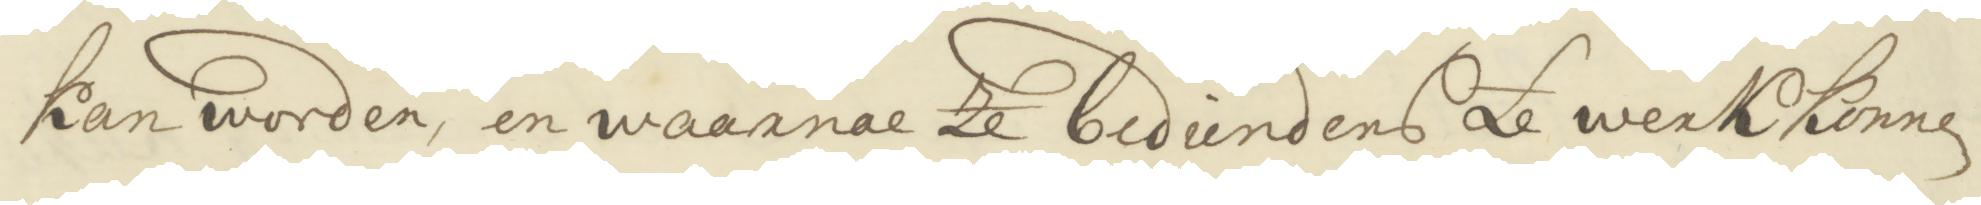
kan worden, en waarnae Ze bediendens te werk konnen
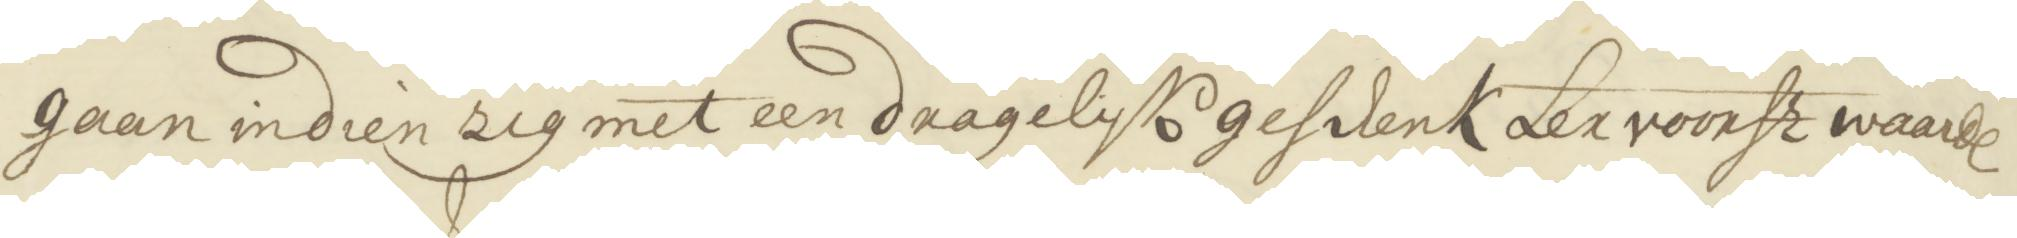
gaan in dien zig met een dragelijk geschenk ter voorsz waarde
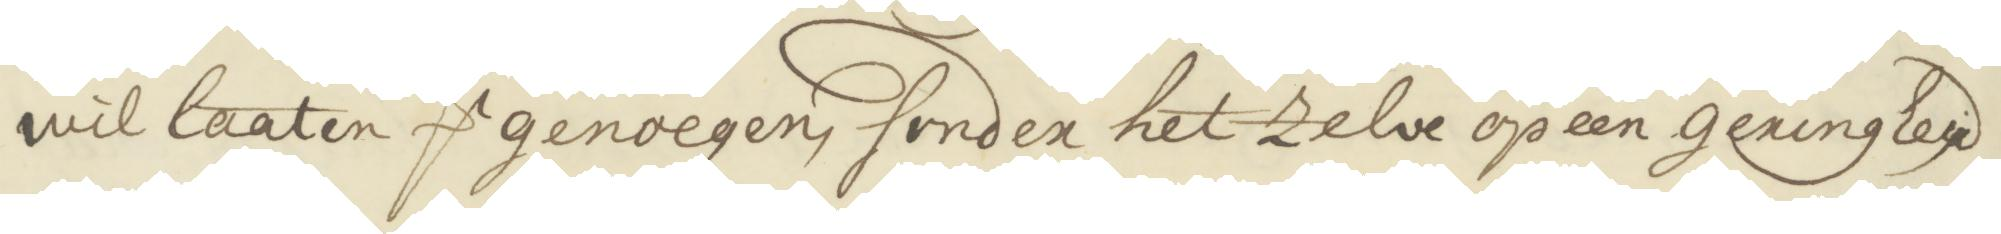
wil laaten vergenoegen sonder het zelve op een geringheijd
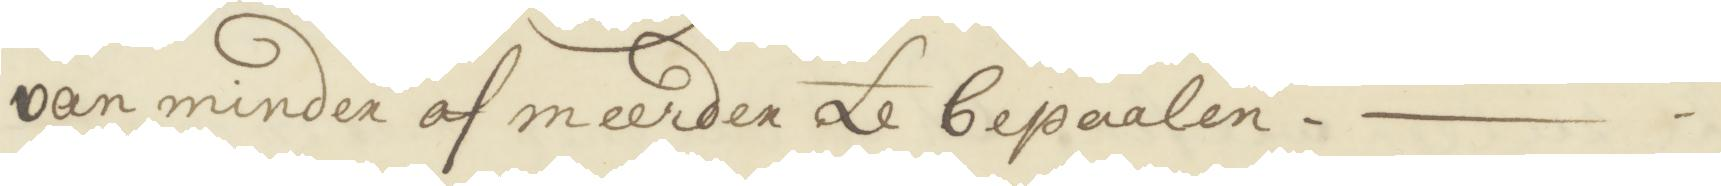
van minder af meerder te bepaalen. —.
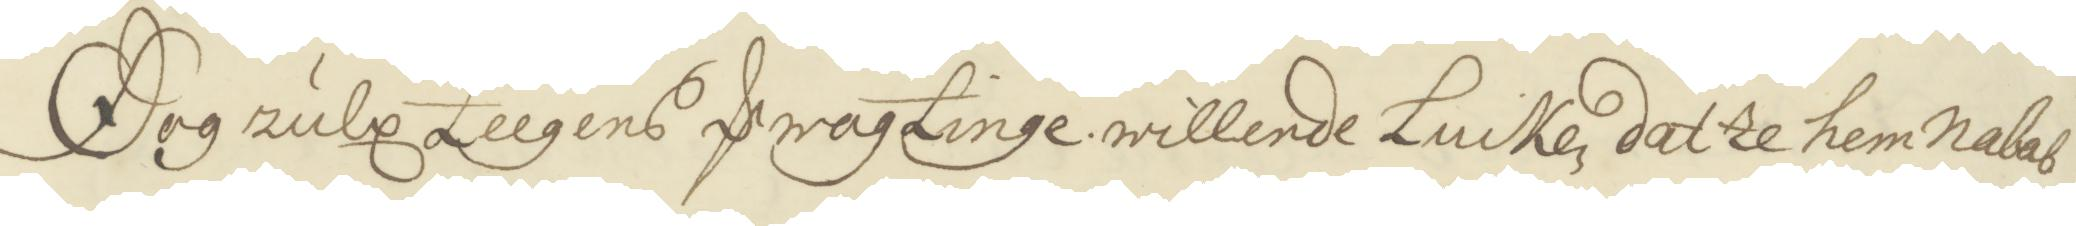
Dog zulx teegens verwagtinge willende Luiken dat ze hem Nabab
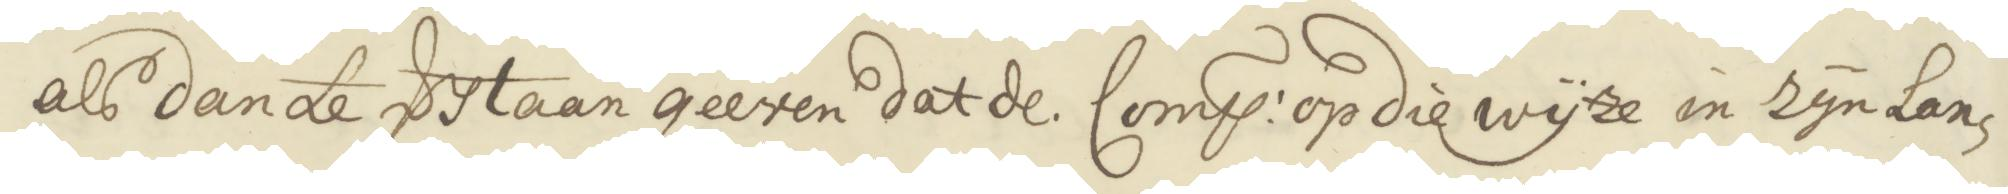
als dan te verstaan geeven dat de Comp: op die wijze in zijn Lan
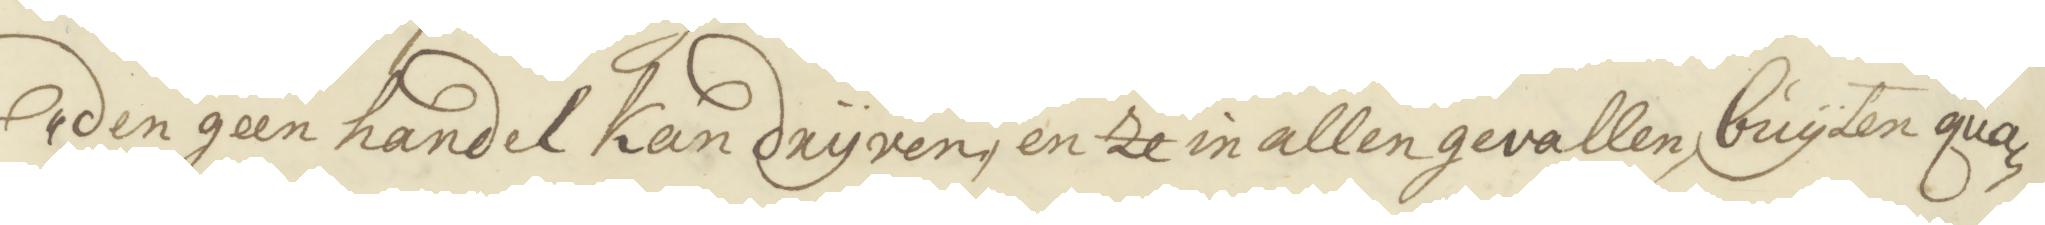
den geen handel kan drijven, en ze in allen gevallen, buijten qua„
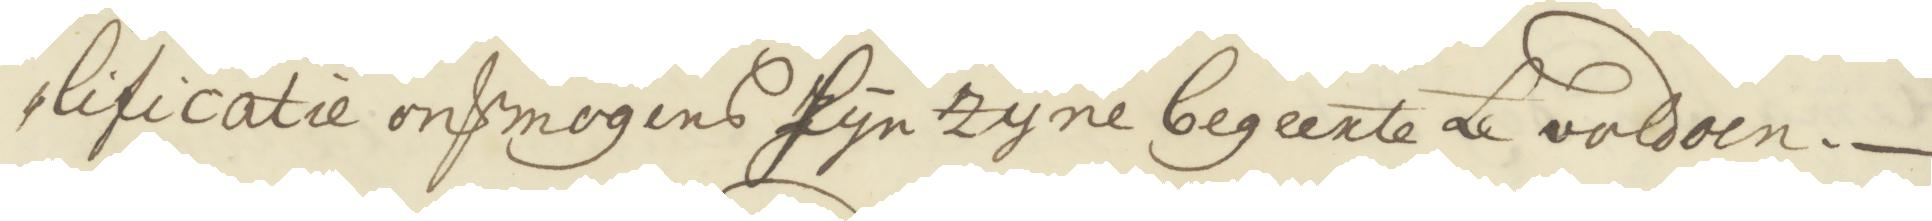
„lificatie onvermogens sijn zijne begeerte te voldoen. —
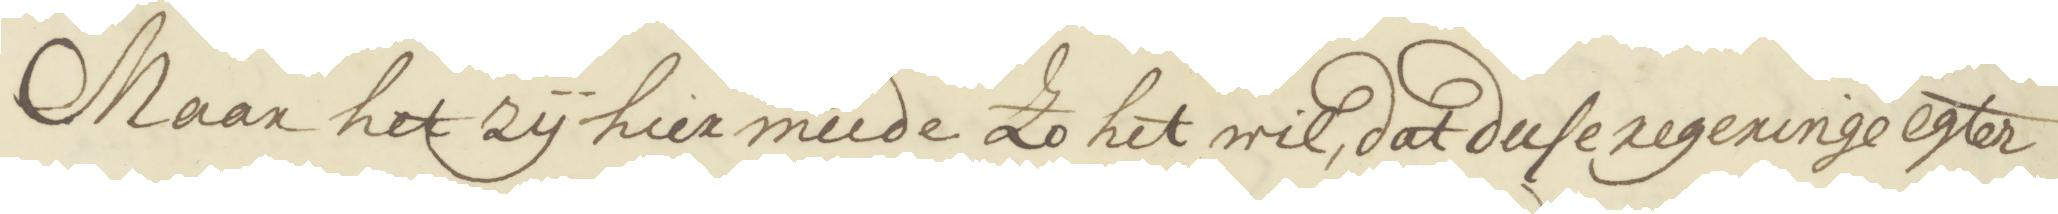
Maar het zij hier meede Zo het wil, dat deese regeringe egter
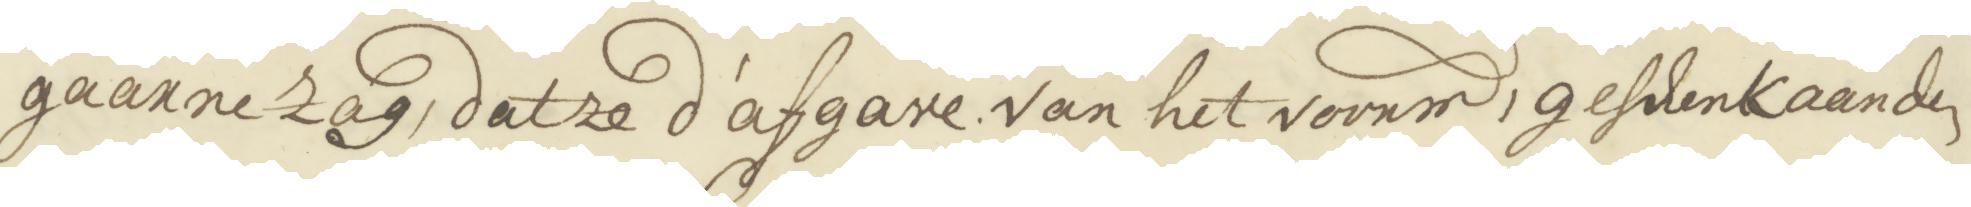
gaarne zag, dat ze d’ afgave van het voorm: geschenk aan den
